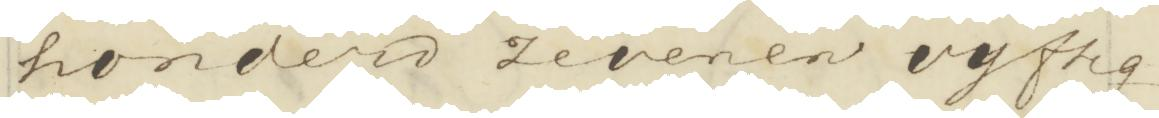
honderd zeven en vyftig
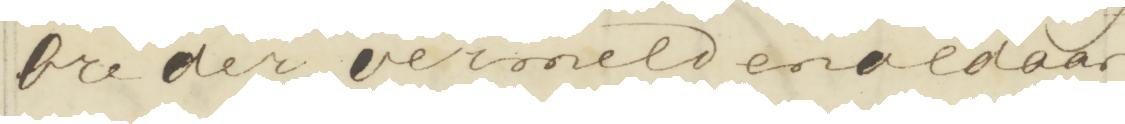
breder vermeld en aldaar
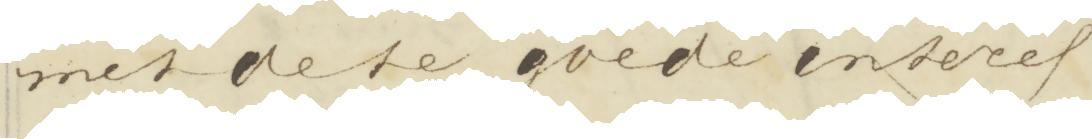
met de te goede interes
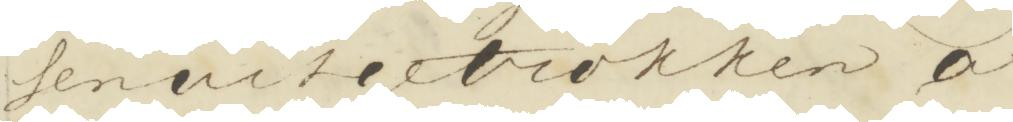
sen uitgetrokken a
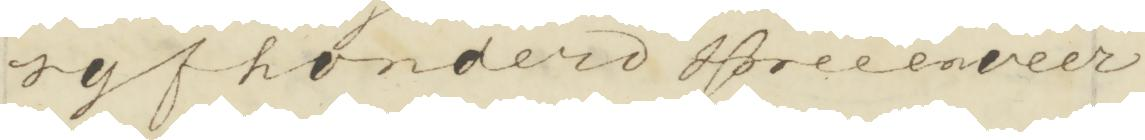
vyfhonderd tweeenveer
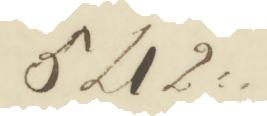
542:
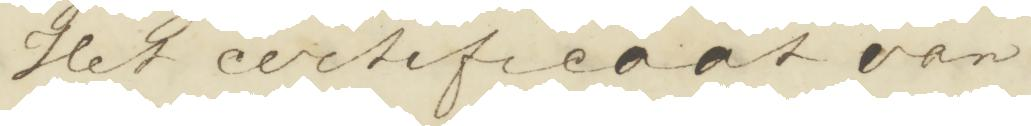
Het certificaat van
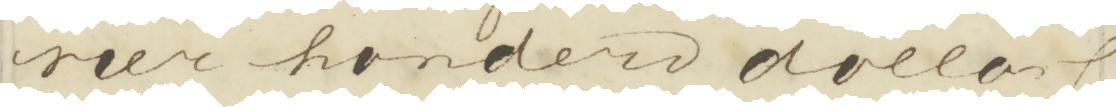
vier honderd dollars
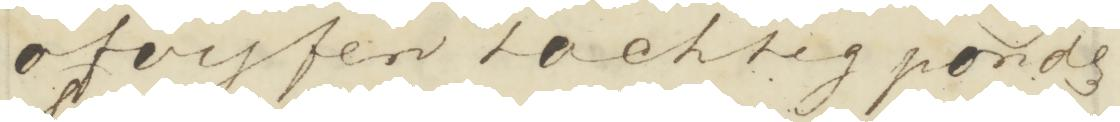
of vyfen tachtig ponden
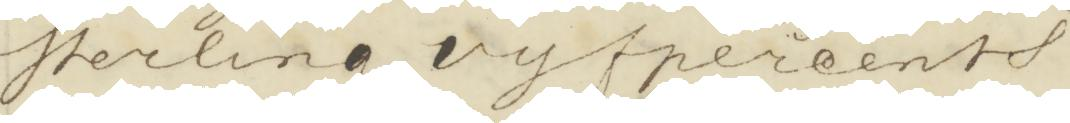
sterling vyfpercents
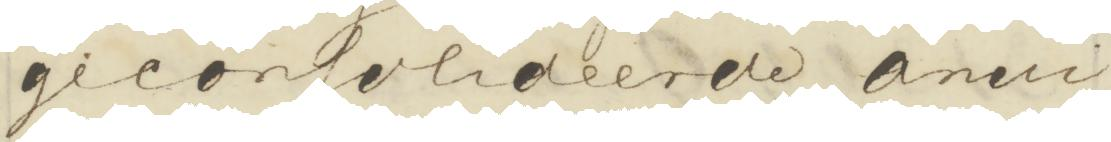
geconsolideerde anui
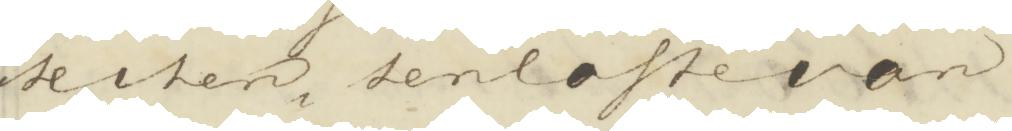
teiten, ten laste van
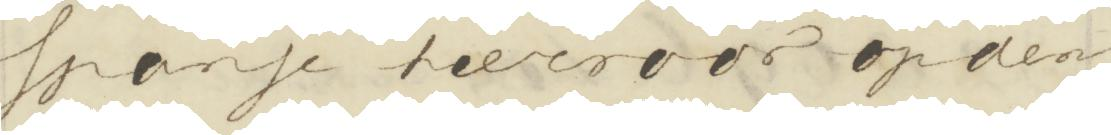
spanje hiervoor op den
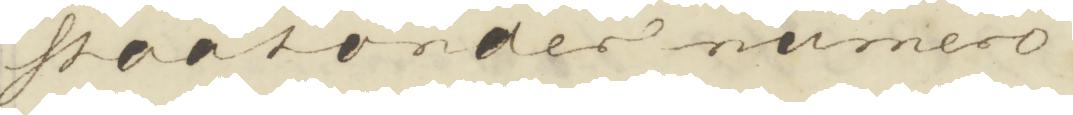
staat onder numero
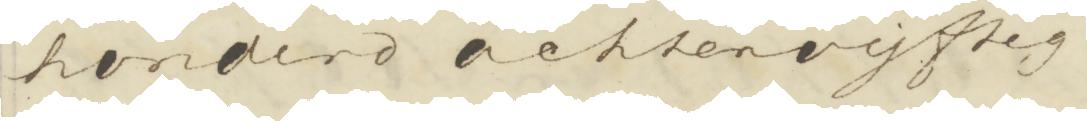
honderd achtenvyftig
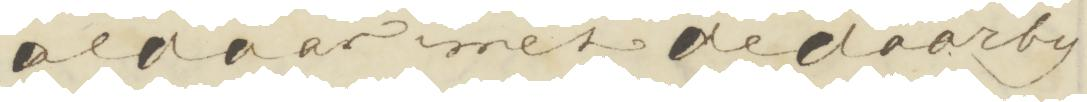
aldaar met de daarby
